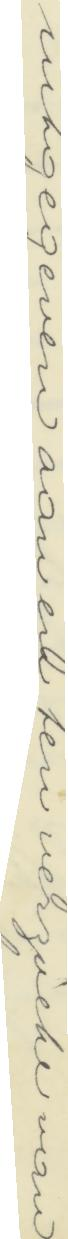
uitgegeven aan en ten verzoeke van
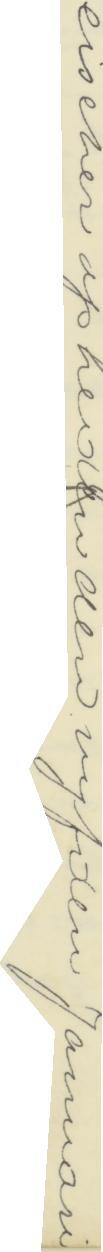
eischer op heden den vyfden Januari
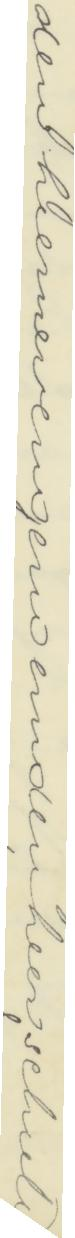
den hiernevengenoemde heer schuld
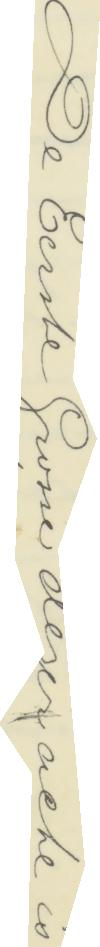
De Eerste Grosse dezer acte is
